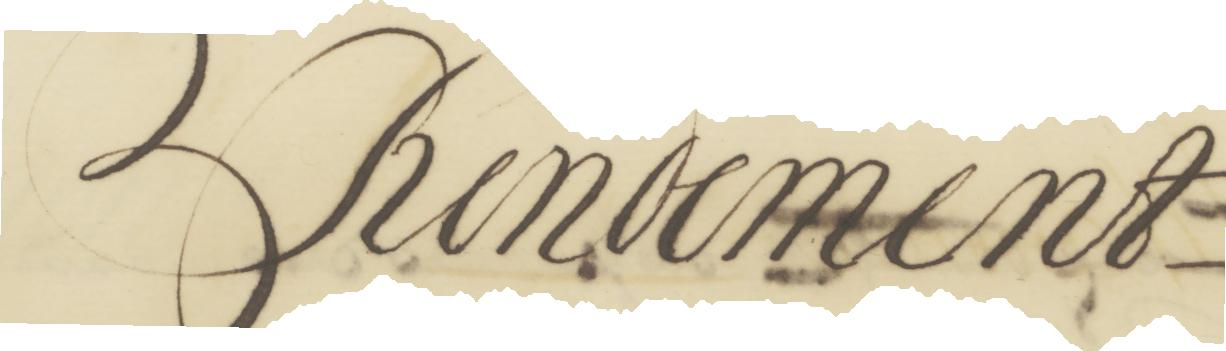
Rendement—
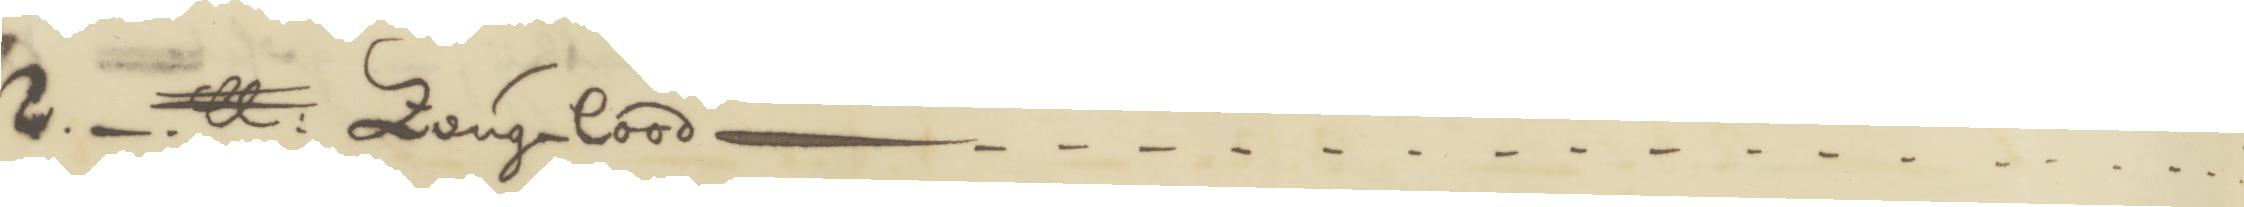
2. —. lb: Zeug-lood — - - - - - - - - - - - - - - - - -
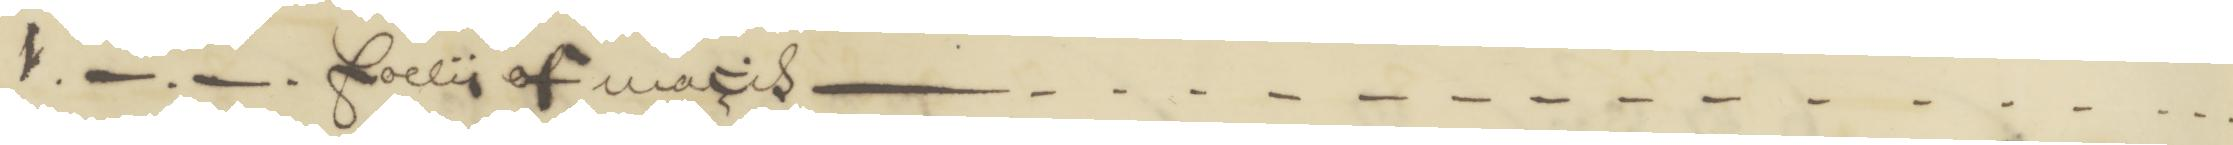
1. —. —. foelij of maçis — - - - - - - - - - - - - - - - -
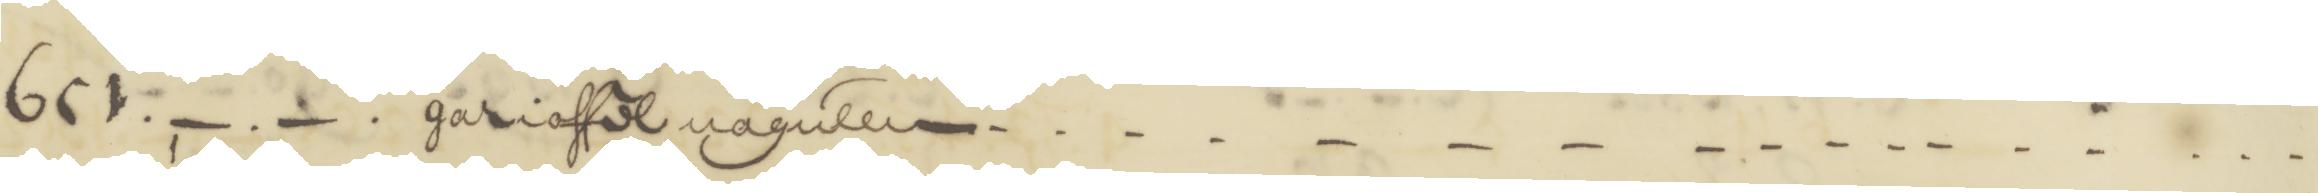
651. —. —. gariaffel nagulen - - - - - - - - - - - - - - - - -
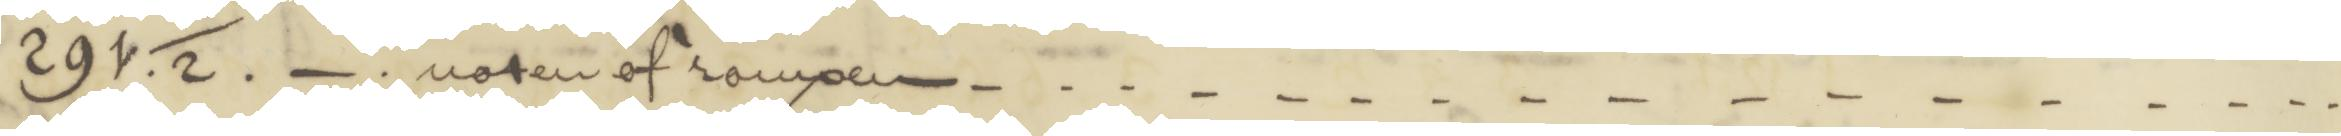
291. ½. —. noten of rompen - - - - - - - - - - - - - - - - -
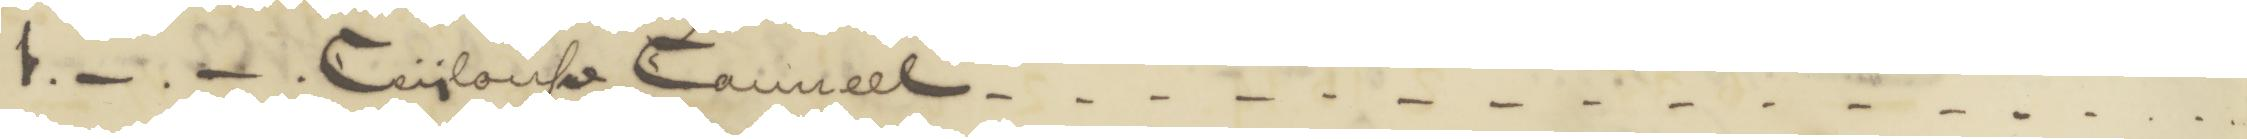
1. —. —. Ceijlonse Canneel - - - - - - - - - - - - - - - - -
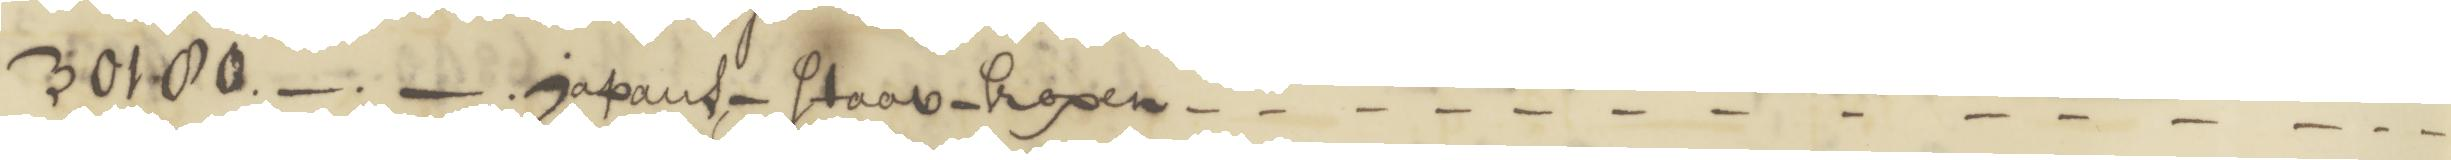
30180. —. —. japans-staav-koper - - - - - - - - - - - - - -
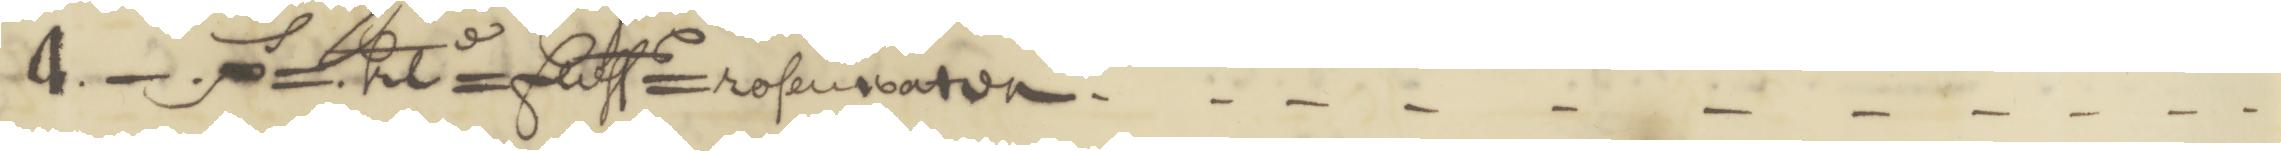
4. —. p=s. kl=e fless=s rosenwater - - - - - - - - - - -
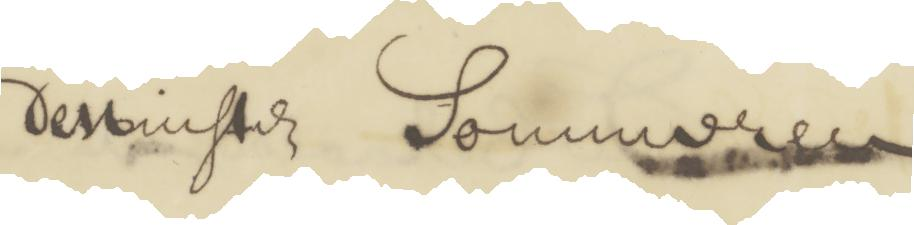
dewinsten sommeren
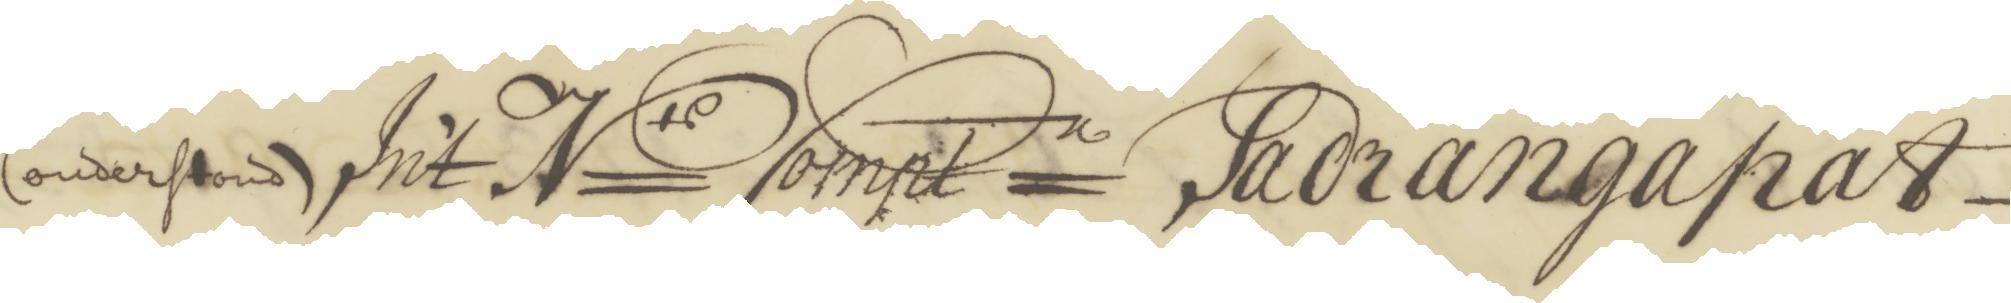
(onderstond) In't N=ts Compt=r Sadrangapat —
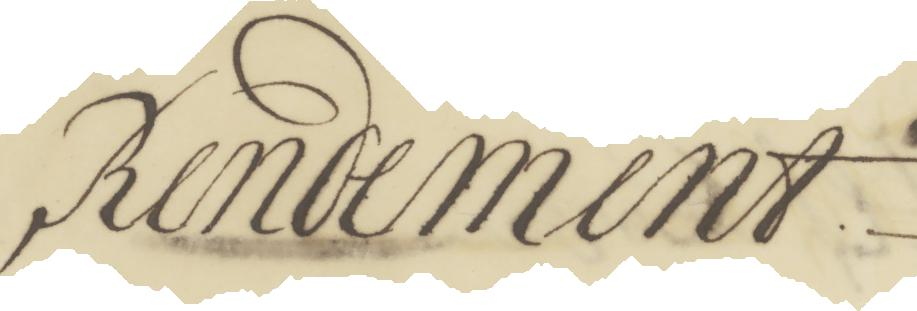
Rendement. —
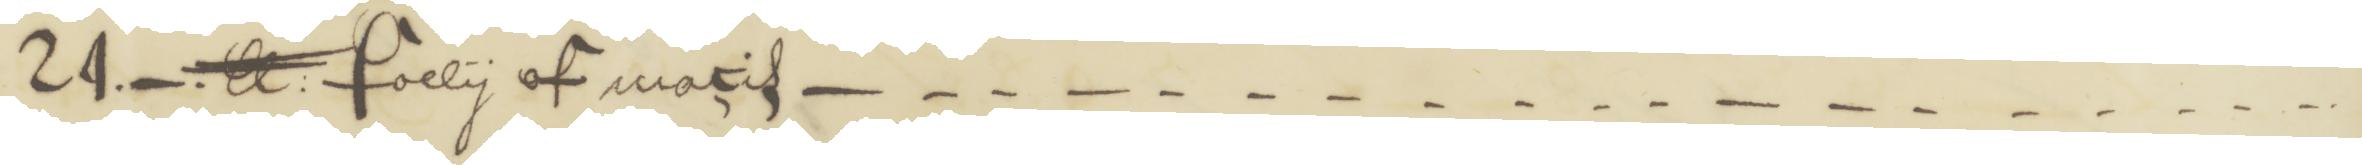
24. —. lb: foelij of maçis — - - - - - - - - - - - - - - - - - - -
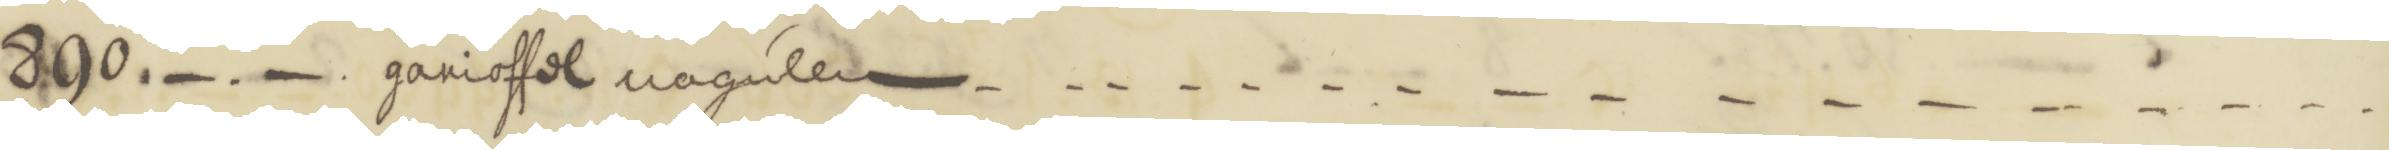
890. —. —. garioffel nagulen — - - - - - - - - - - - - - - - - -
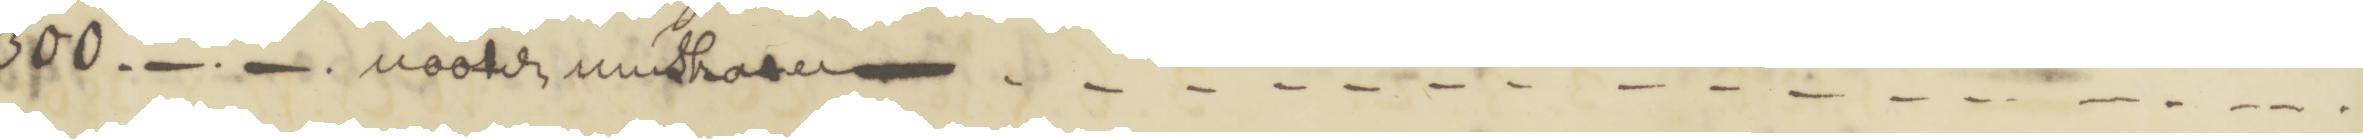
300. —. —. nooten muskaten — - - - - - - - - - - - - - - - - - -
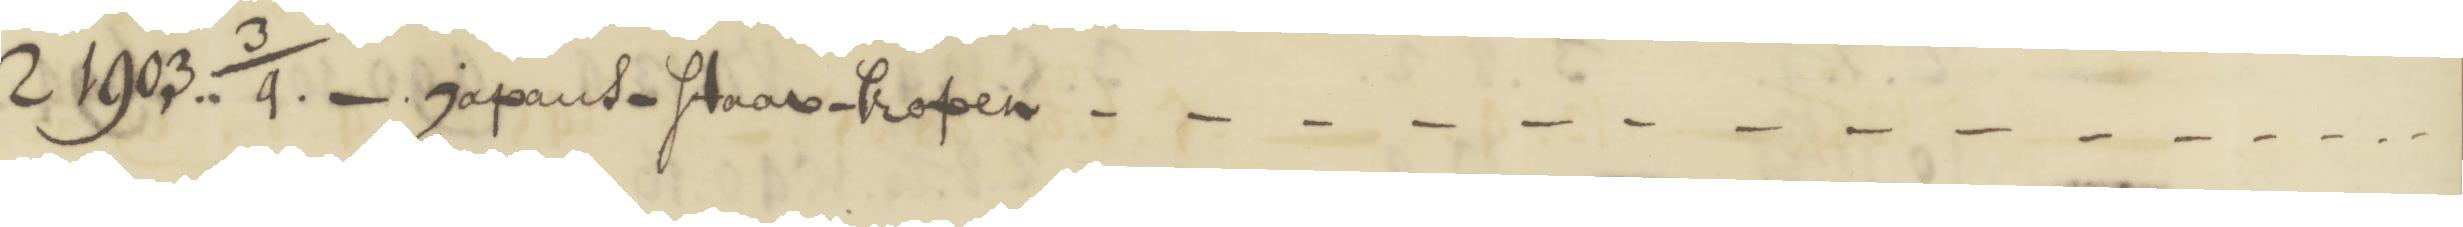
21903. ¾. —. japans-staav-koper - - - - - - - - - - - - - - -
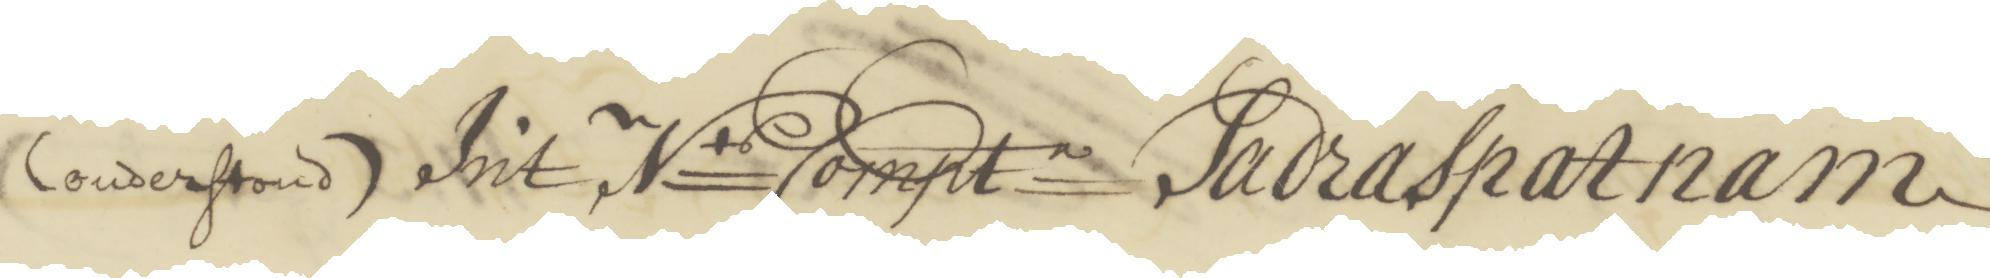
(onderstond) In't N=ts Compt=r Sadraspatnam
